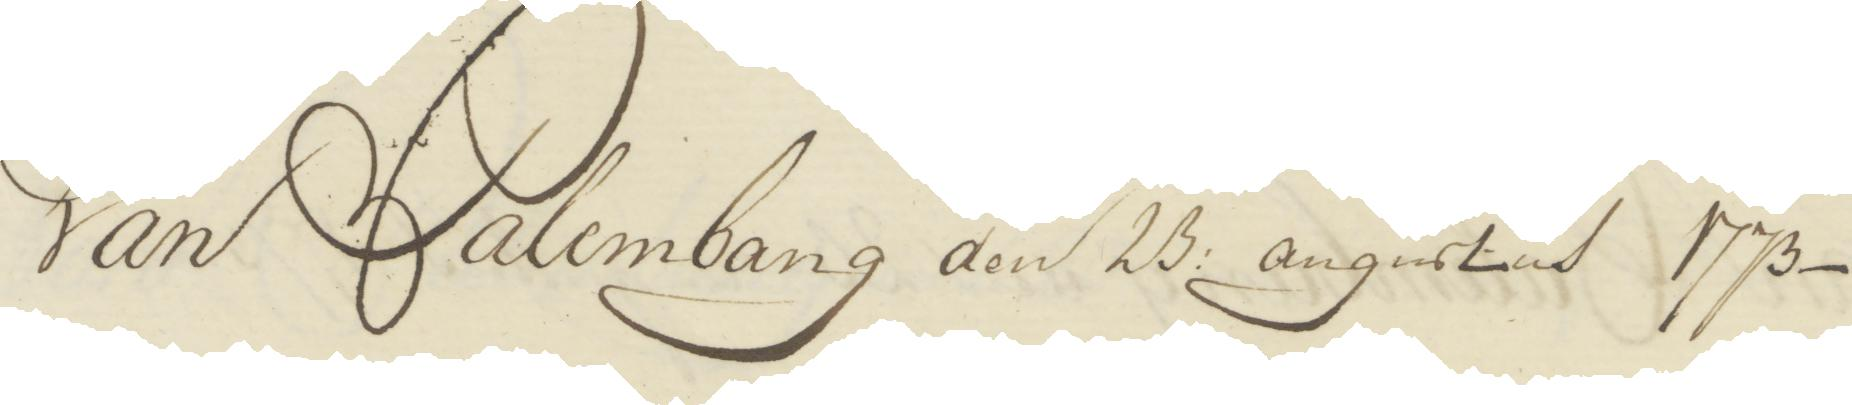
Van Palembang den 23: augustus 1773_
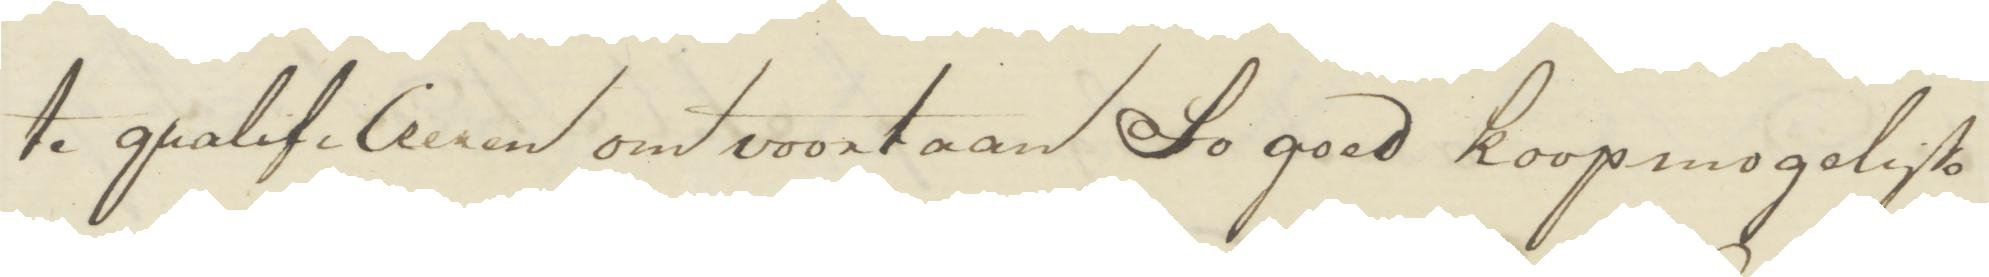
te qualificeeren om voortaan so goed koop mogelijk
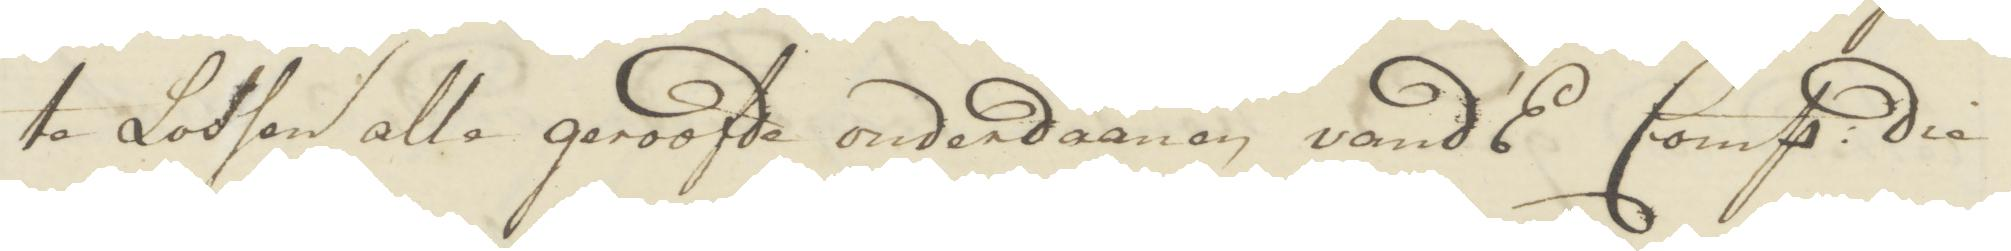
te Lossen alle geroofde onderdaanen vand’ E Comp: die
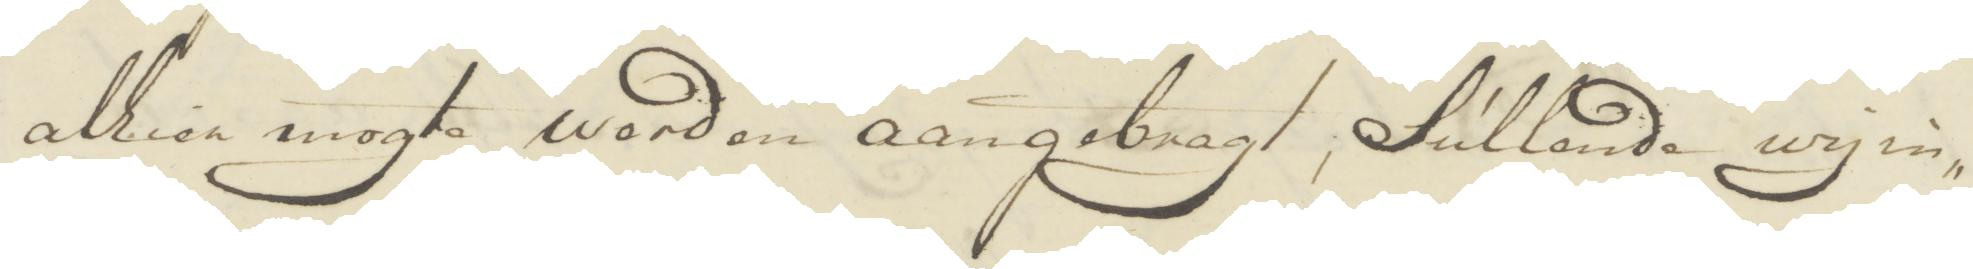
alhier mogte werden aangebragt; sullende wij in„
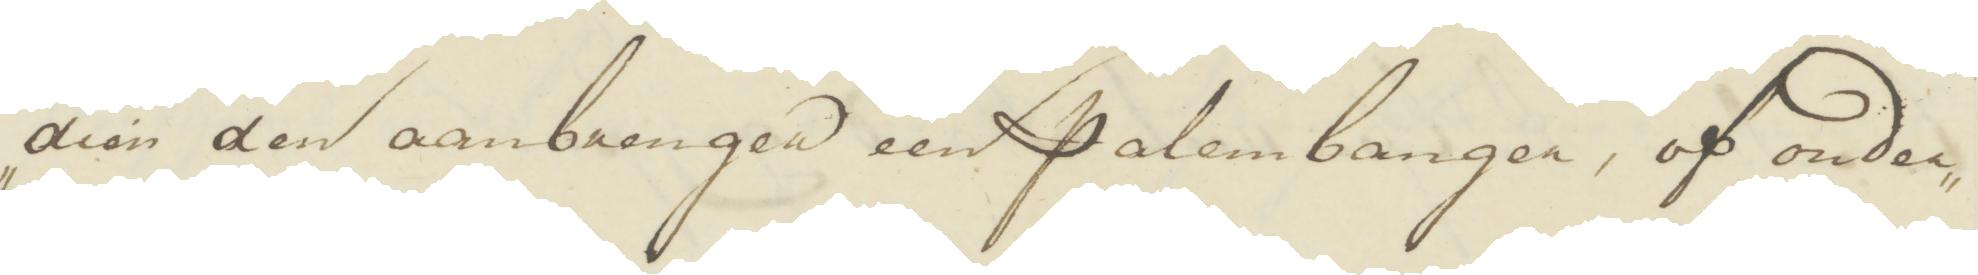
„dien den aanbrenger een Palembanger, of onder„
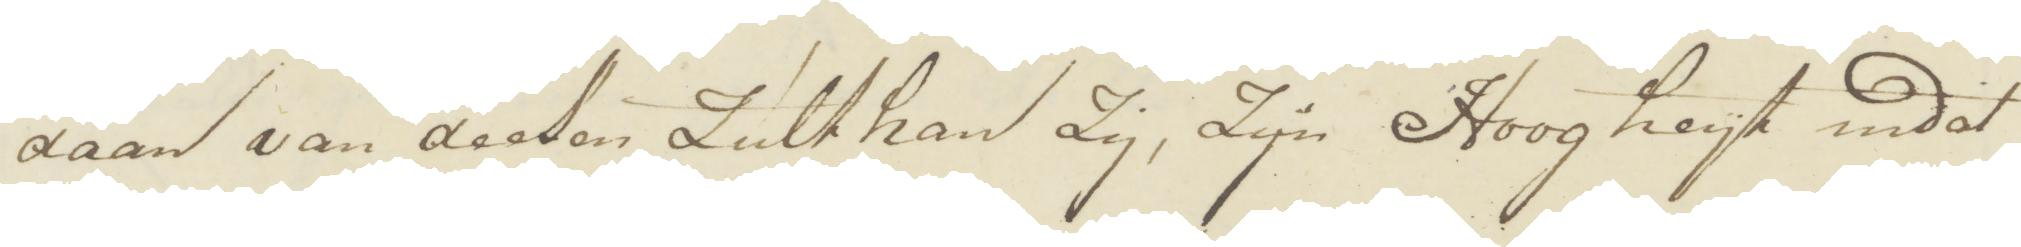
daan van deesen zulthan zij, zijn Hoogheijt indat
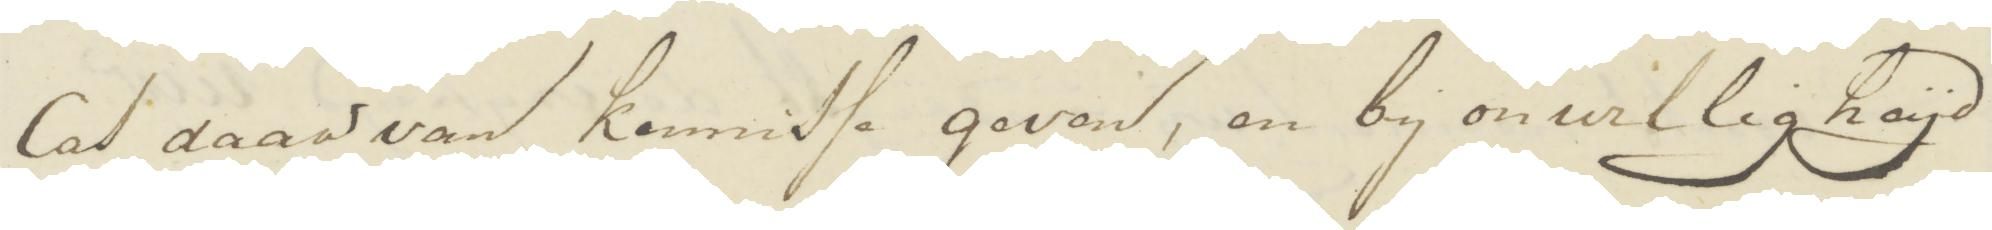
Cas daar van kennisse geven, en by onwilligheijd
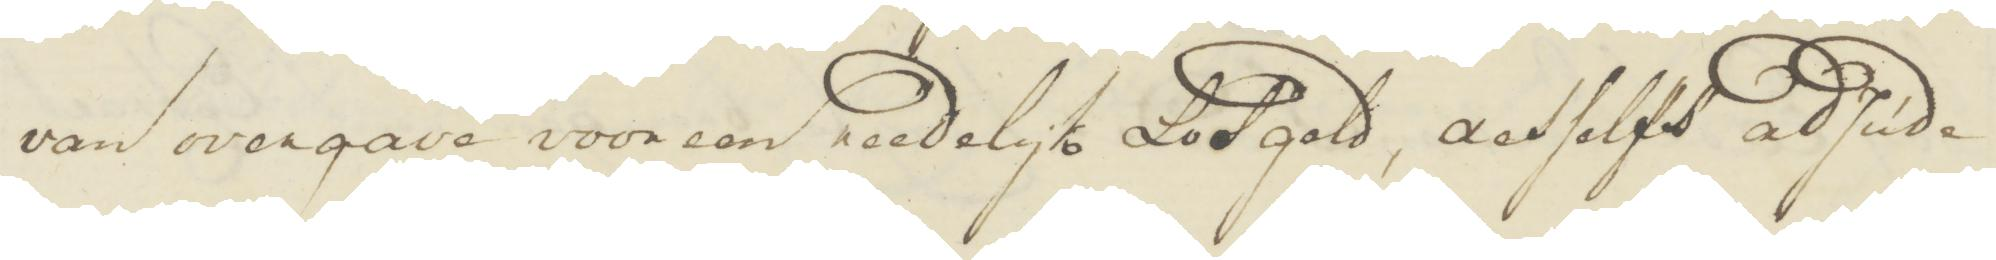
van overgave voor een reedelijk Losgeld, desselfs ad Jude
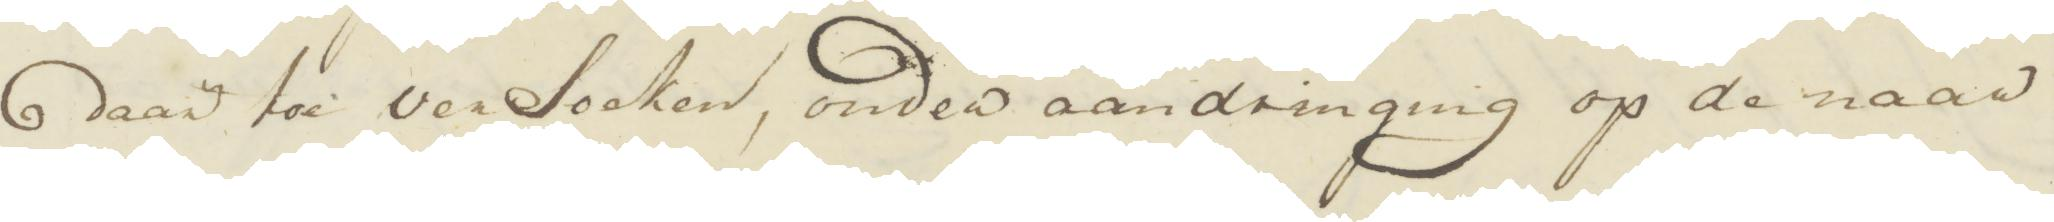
daar toe versoeken, onder aandringing op de naar
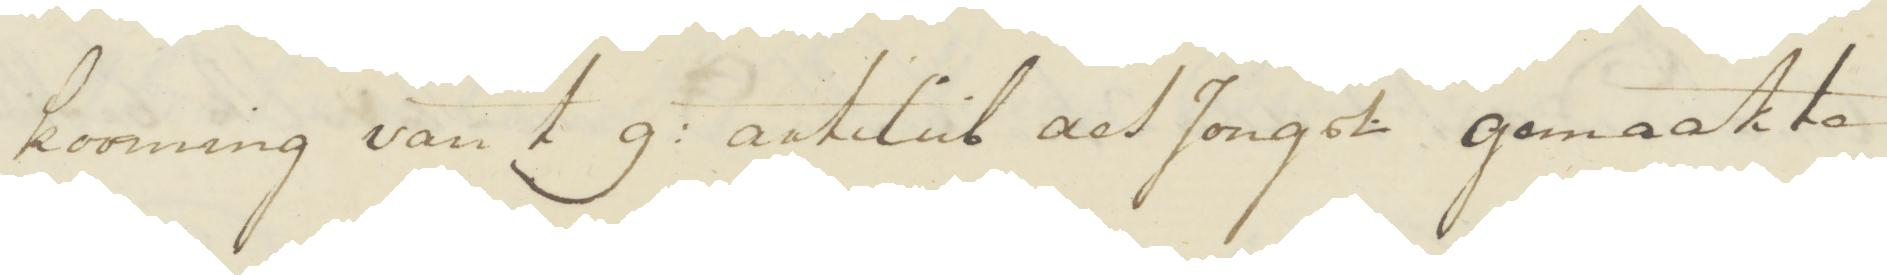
kooming van 't 9: articul des Jongst gemaakte
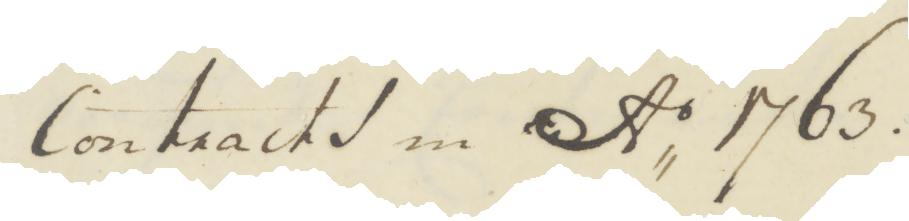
Contracts in A„o 1763.
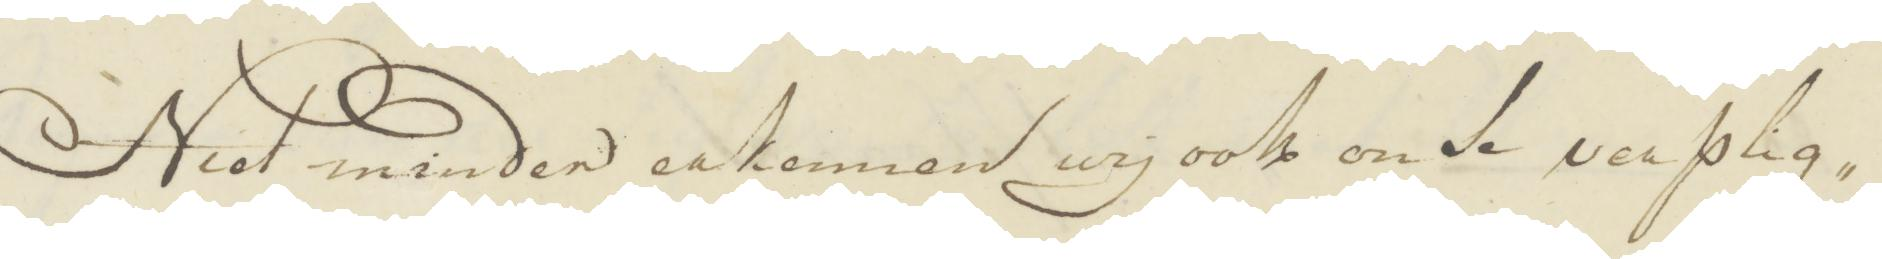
Niet minder erkennen wij ook onse verplig„
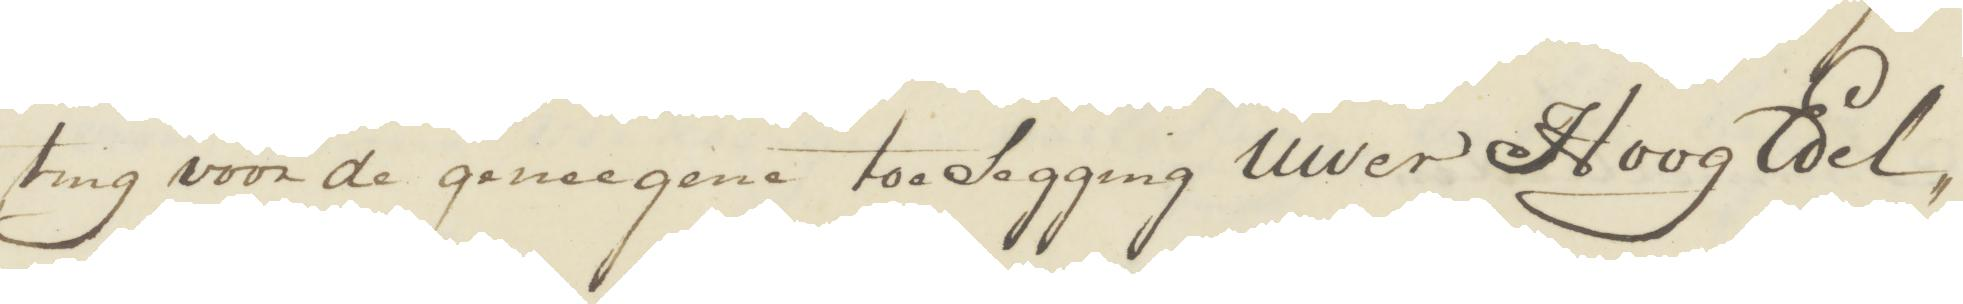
ting voor de geneegene toesegging Uwer Hoog Edel„
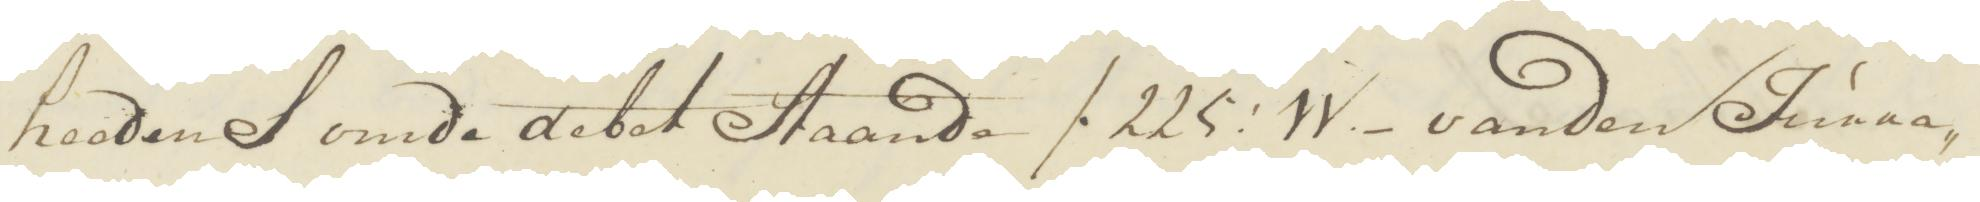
heedens omde debet staande ƒ 225:11._ van den Iurra„
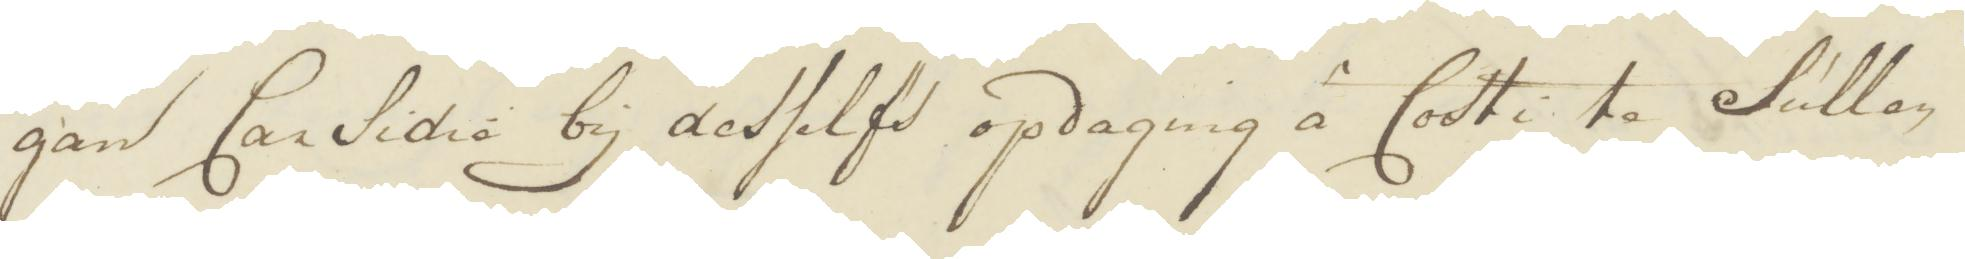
gan carsidie bij desselfs opdaging â Costi te sullen
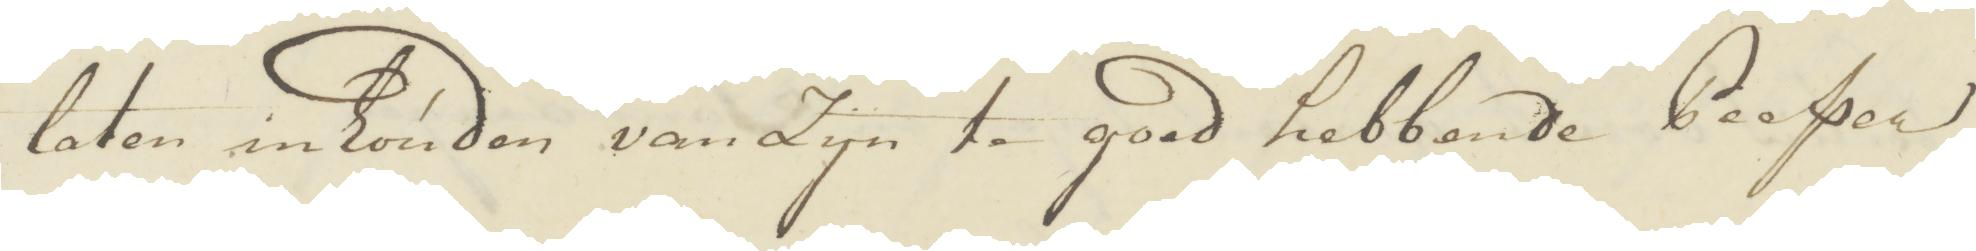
laten in houden van zijn te goed hebbende Peeper
